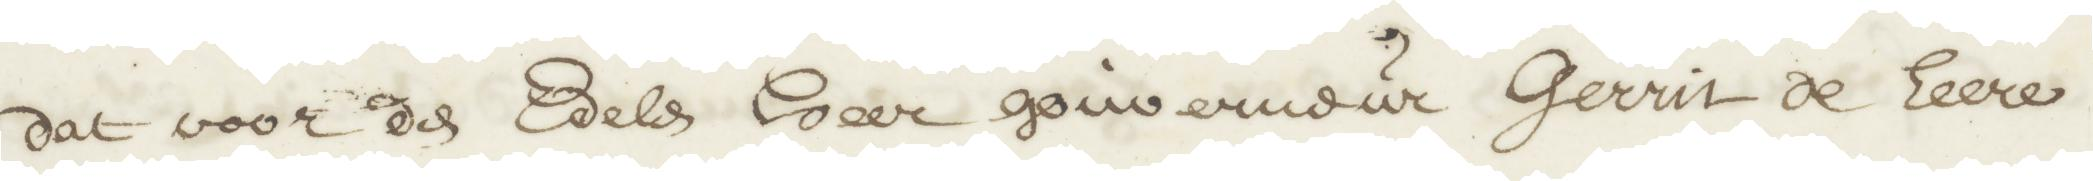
dat voor den Edelen Heer gouverneur Gerrit de heere
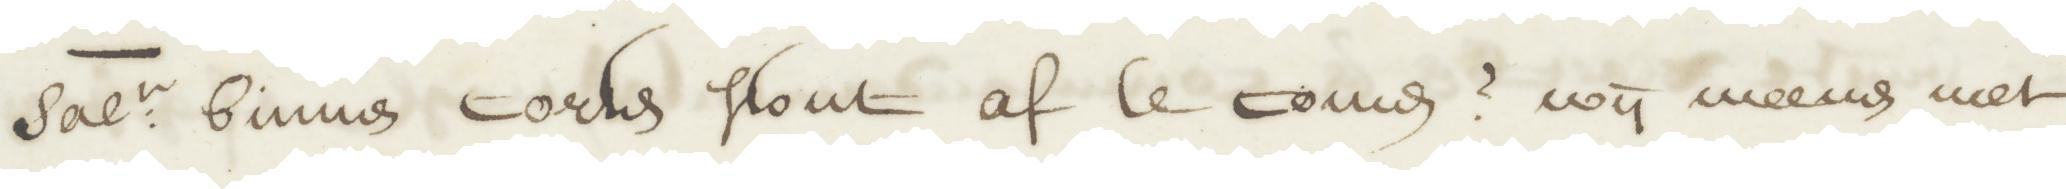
sal:r binnen corten stont af te comen ? wij meenen met
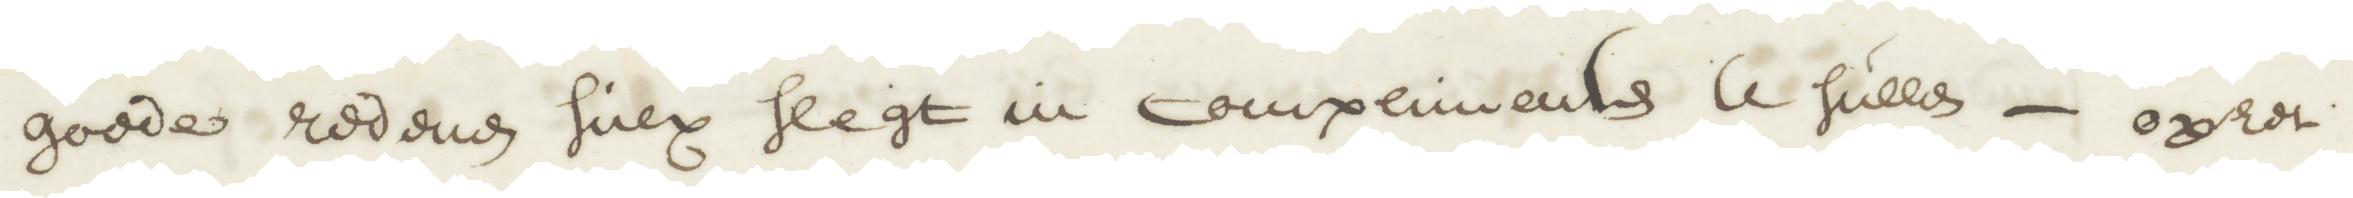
goede redenen sulx slegt in complimenten te sullen — op het
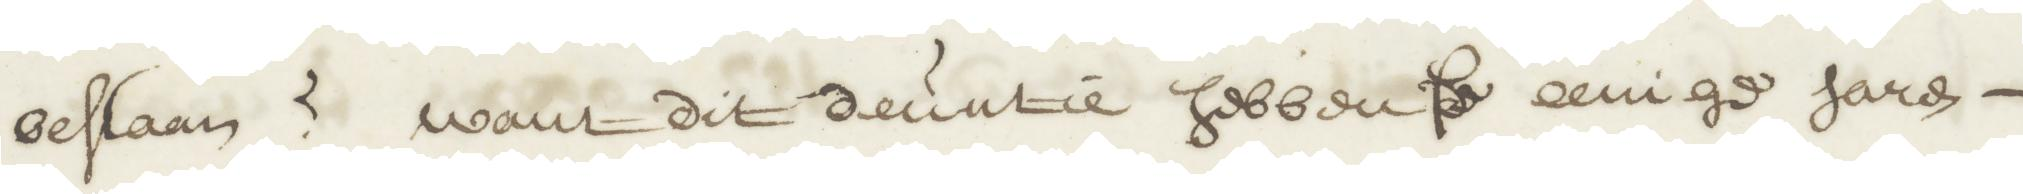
bestaan ? want dit deuntie hebben se eenige jaren
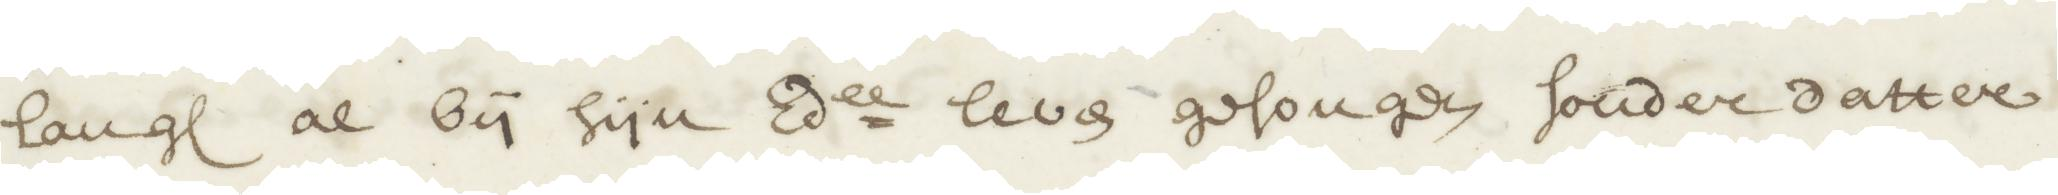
langh al bij sijn Ed=le leven gesongen sonder datter
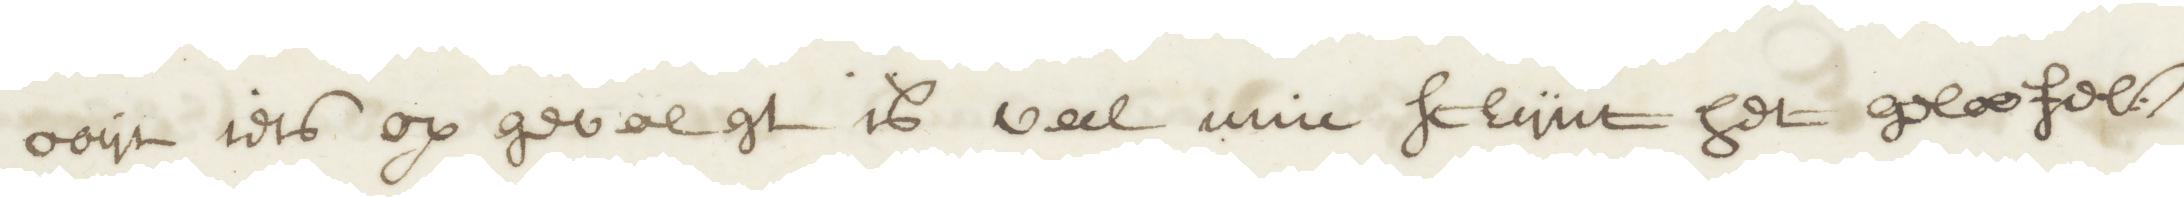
ooijt iets op gevolgt is veel min schijnt het geloofelijk
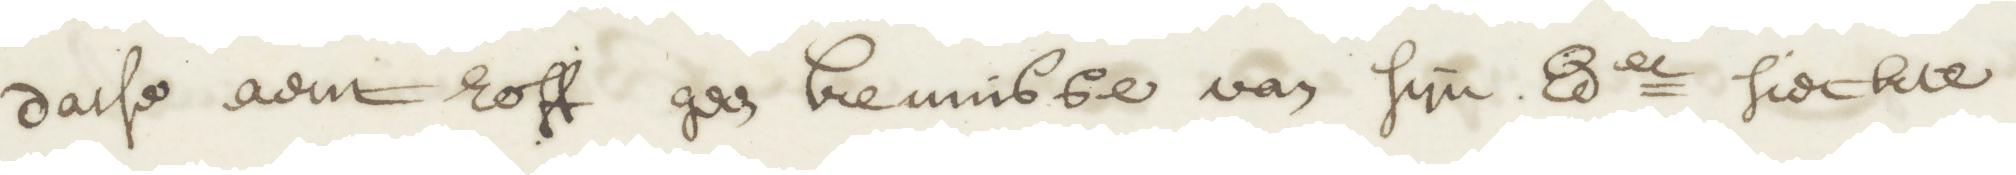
datse aent hoff geen kennisse van sijn. Ed=le sieckte
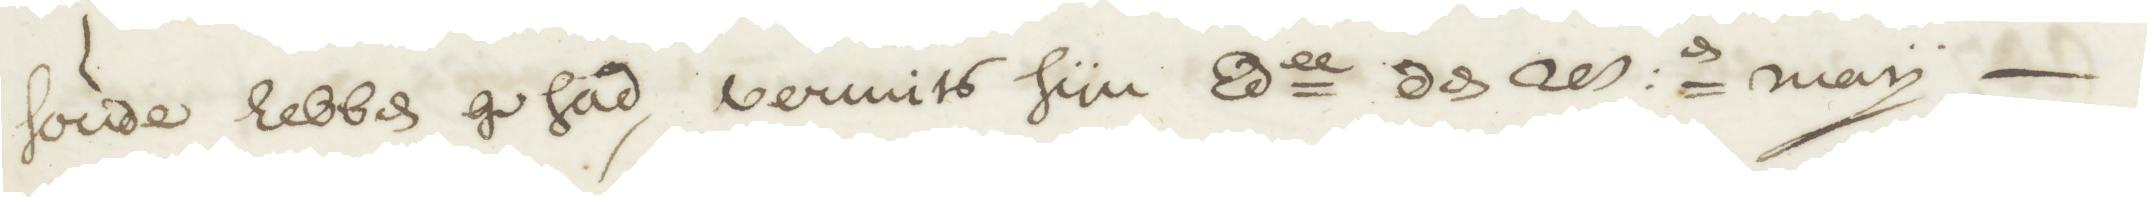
soude hebben gehad, vermits sijn Ed=le den zes:=e maij —
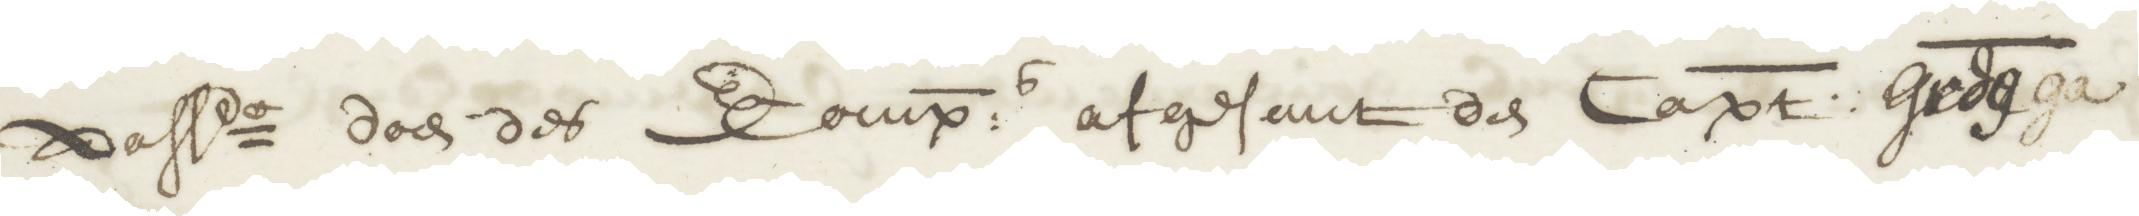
pass=do doen des EComp:s afgesant den Capt: greg ga
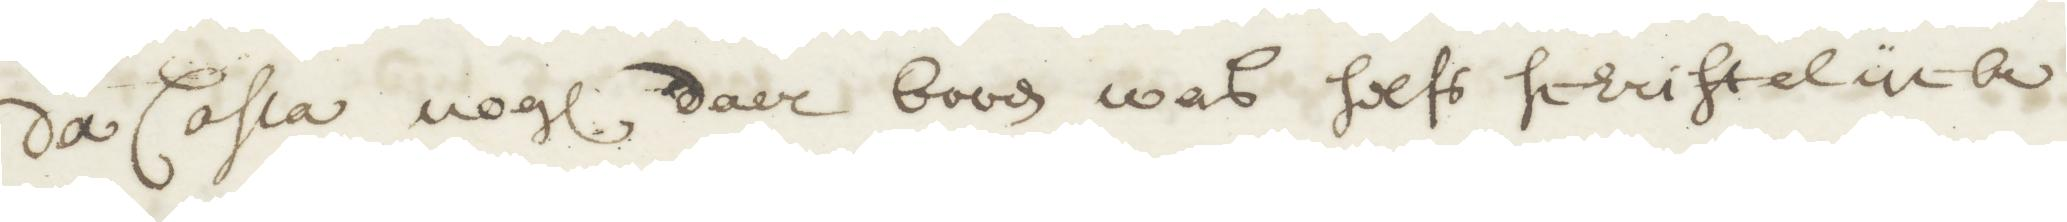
da Costa nogh, daer boven was selfs schriftelijck
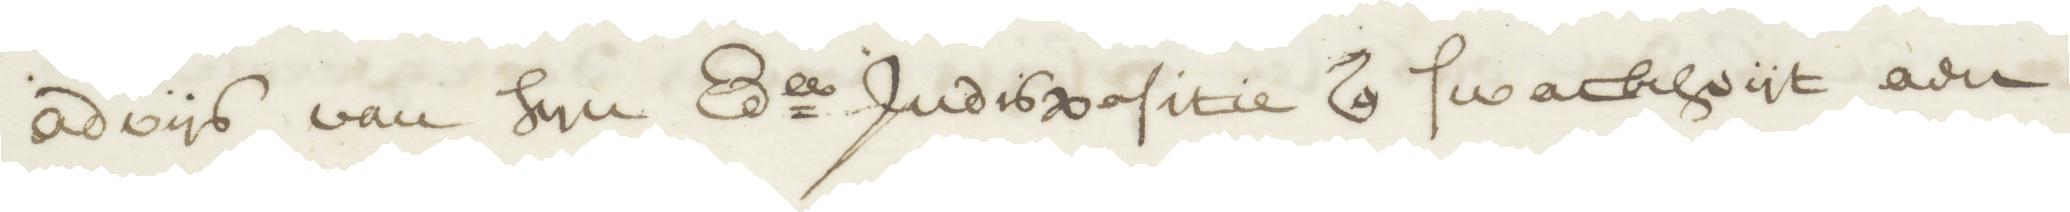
advijs van syn Ed=le Jndispositie en swackheijt aen
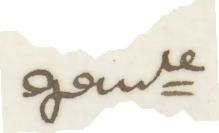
gem=te
